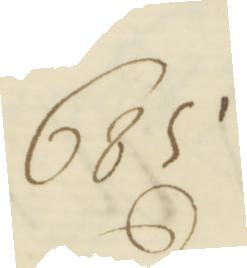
685'
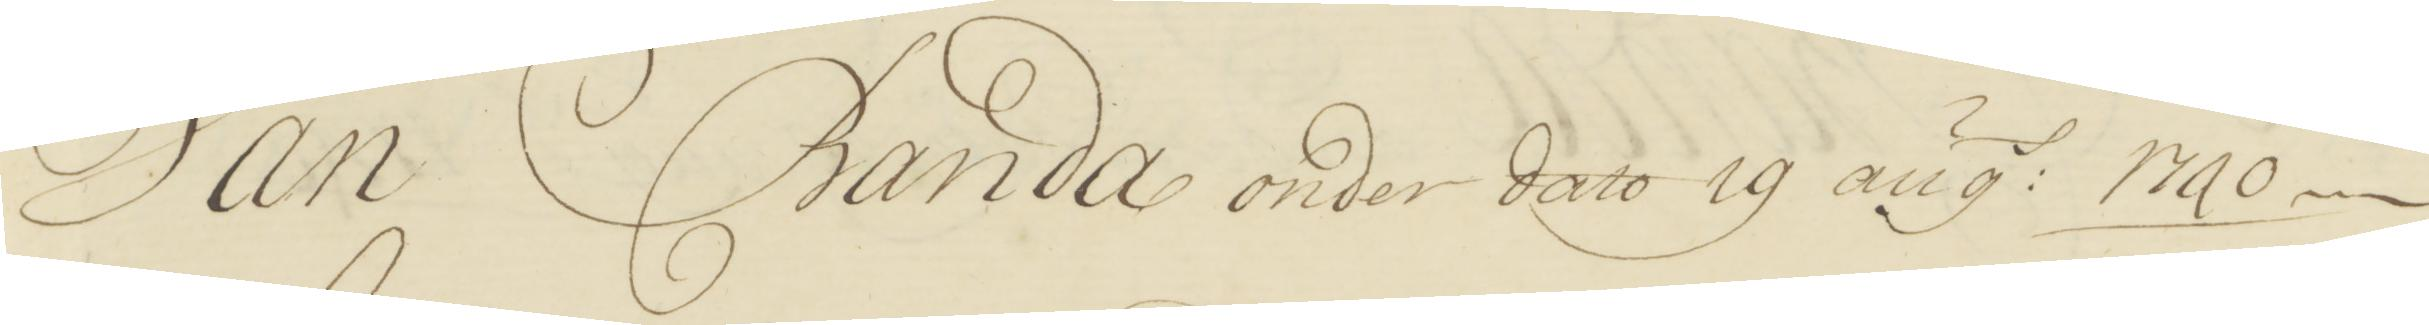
Van Banda onder dato 19 aug:s 1740 —
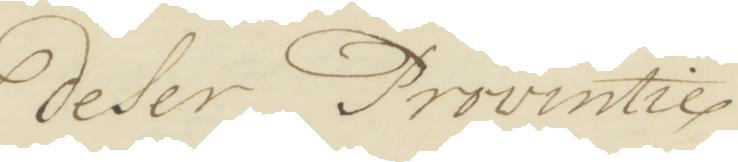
deser Provintie
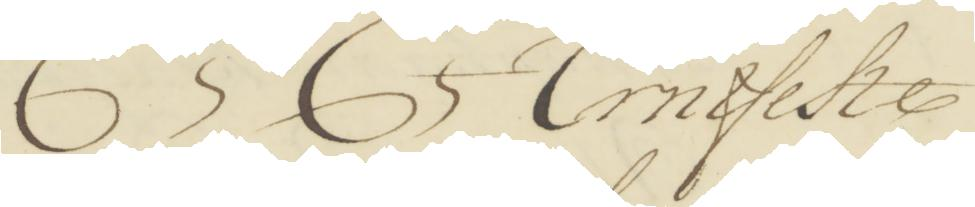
E: E: Erntfeste
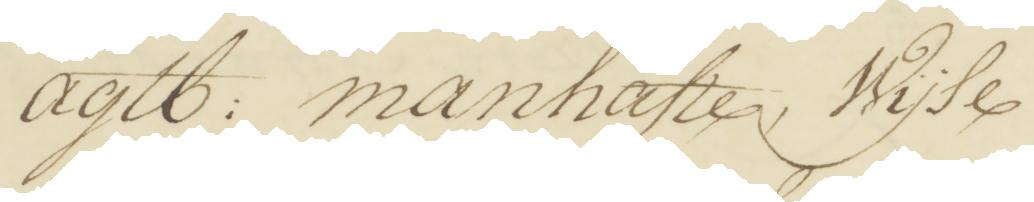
agtb: manhafte, Wijse
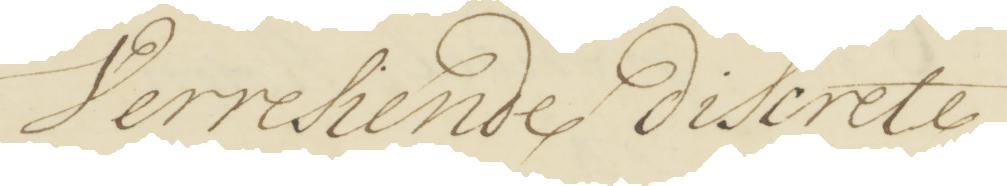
Verresiende discrete,
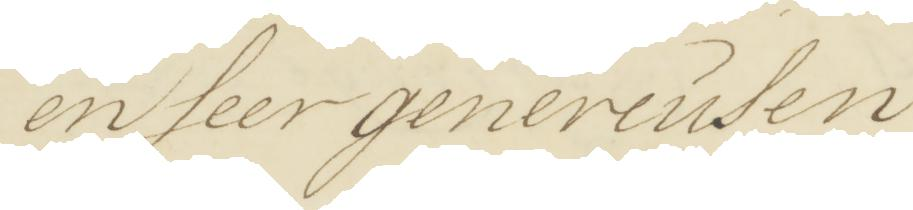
en seer genereusen
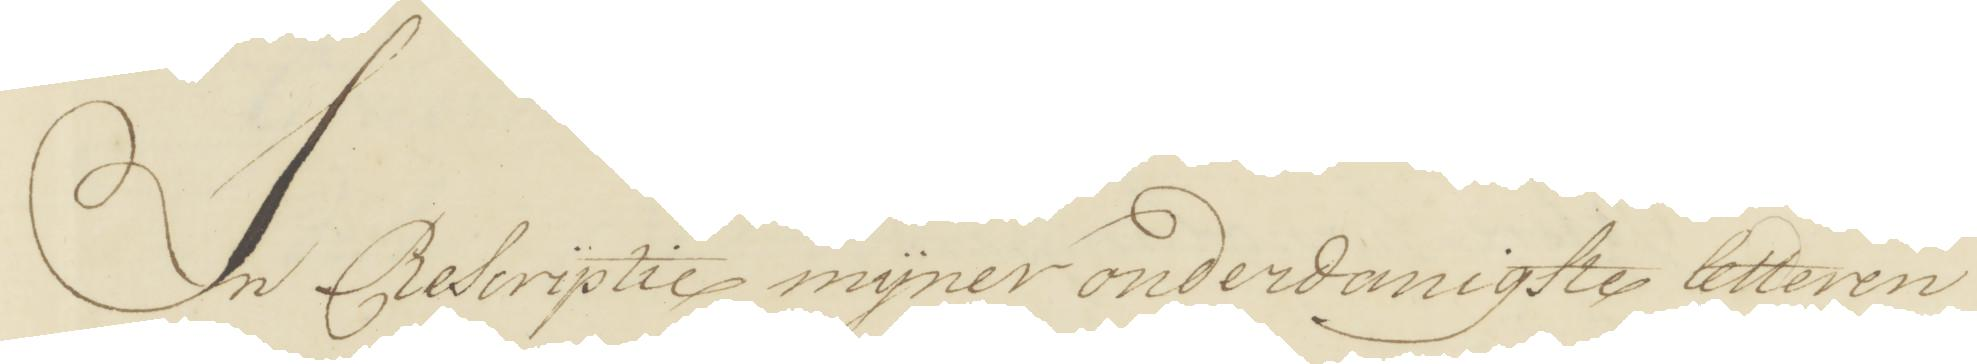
In Rescriptie mijner onderdanigste letteren
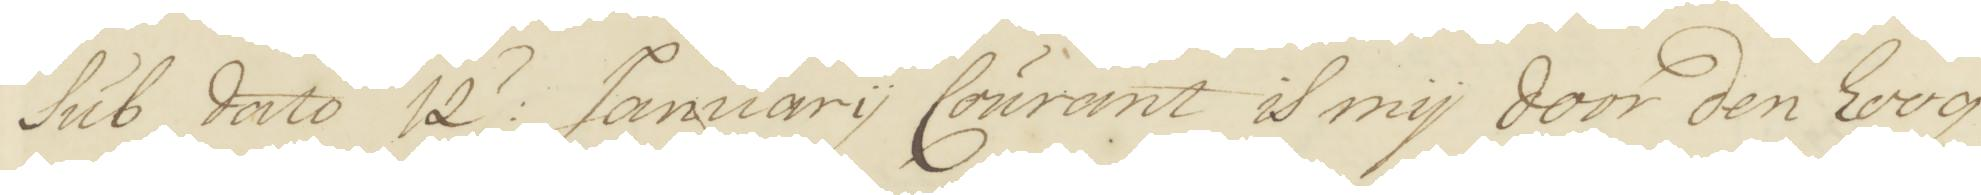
sub dato 12': Januarij Courant is mij door den hoog
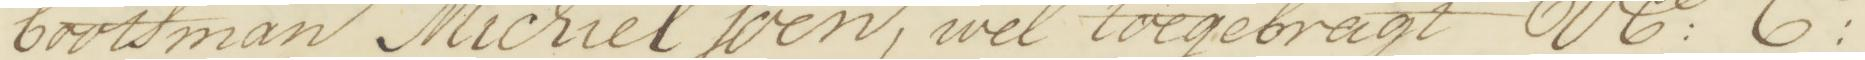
bootsman Michiel soen, wel toegebragt VE: E:
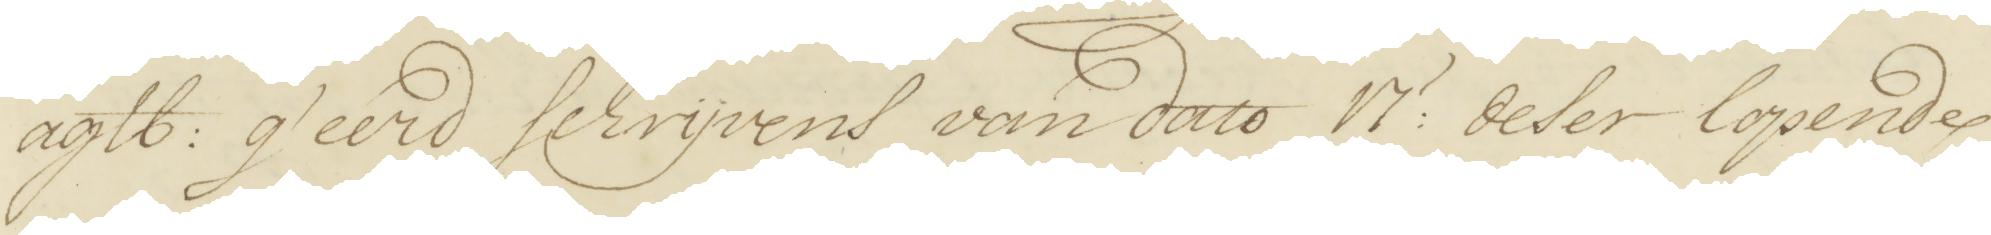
agtb: g’eerd schrijvens van dato 17:' deser lopende
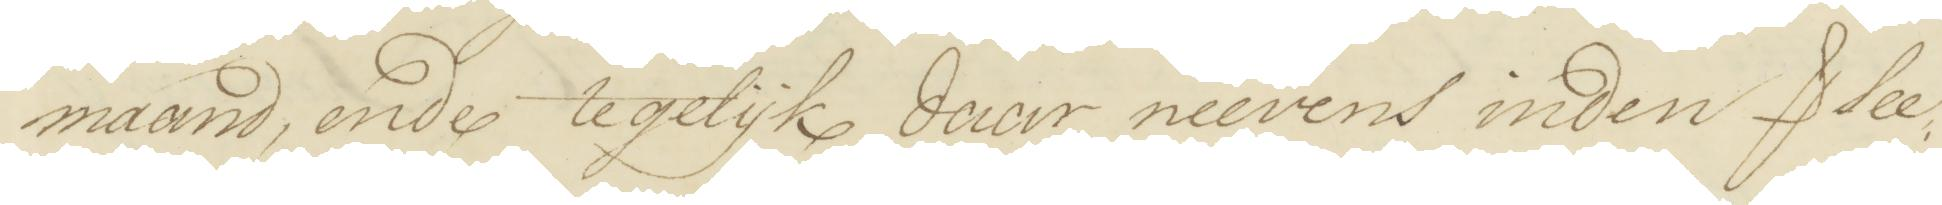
maand, ende tegelijk daar neevens inden versee,
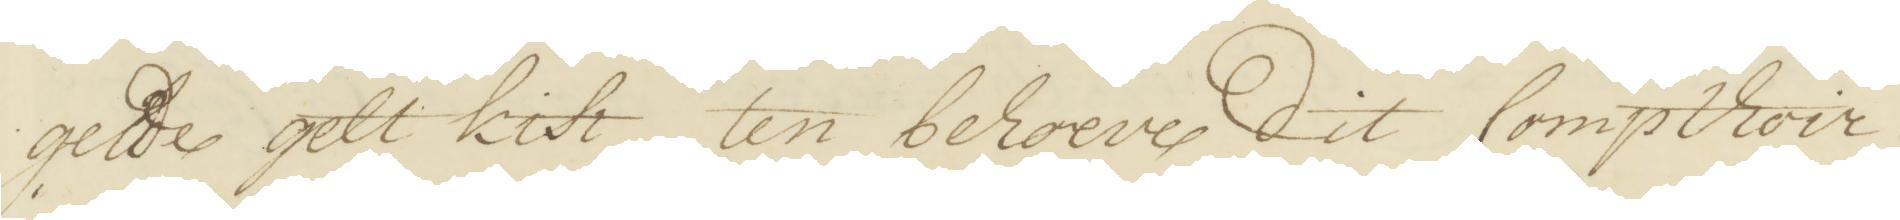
,gelde gelt kist ten behoeve dit Compthoir
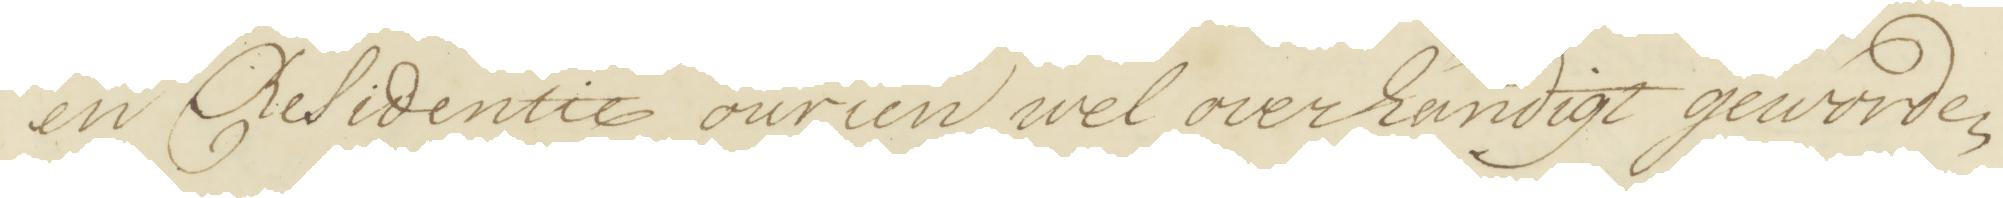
en Residentie ourien wel overhandigt geworden
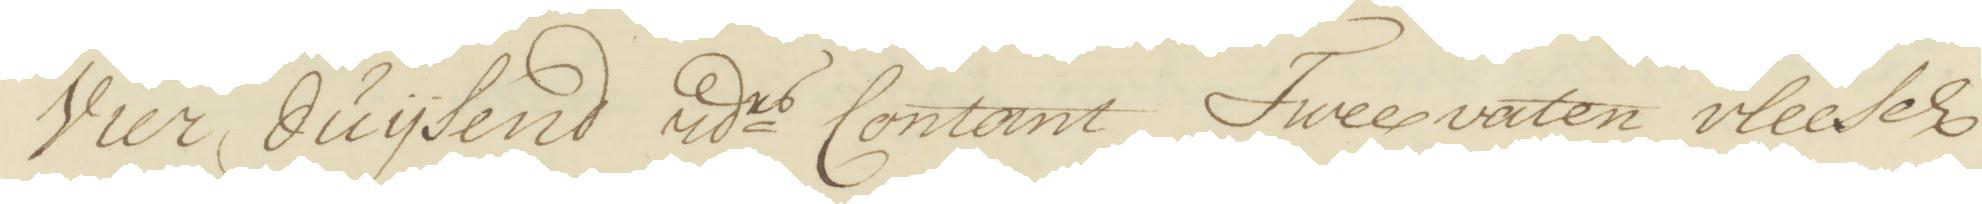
Vier duijsend rd=rs Contant Twee vaten vleesch
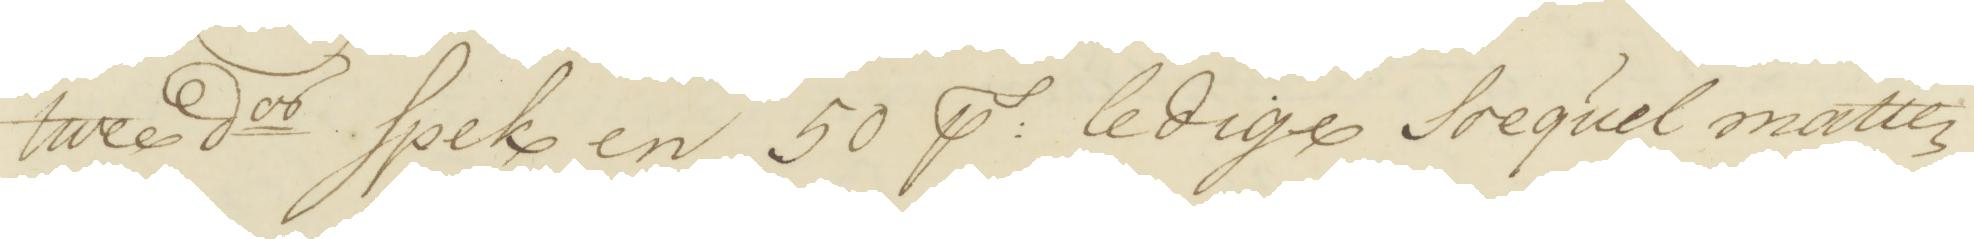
twee d=os spek en 50 p:s ledige soequel matten,
